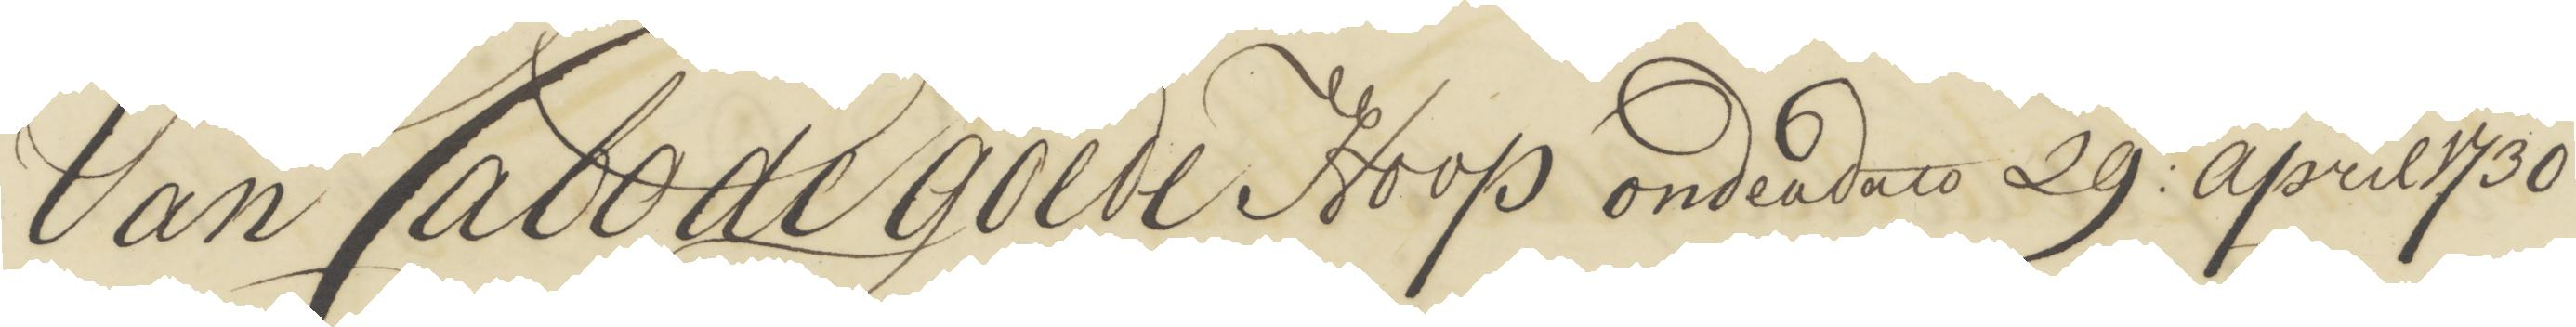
Van Cabo de goede Hoop onder dato 29:' april 1730
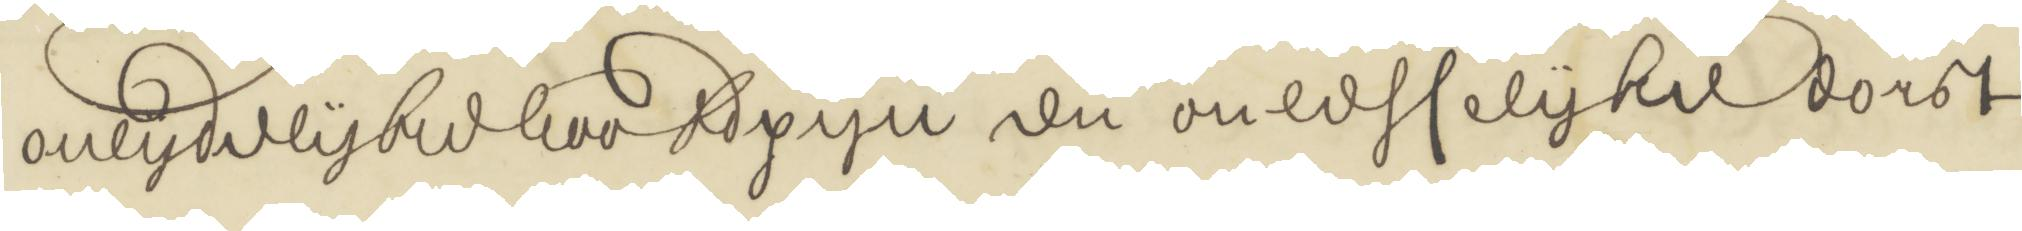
onlijdelijke hoofdpijn en onlesselijke dorst
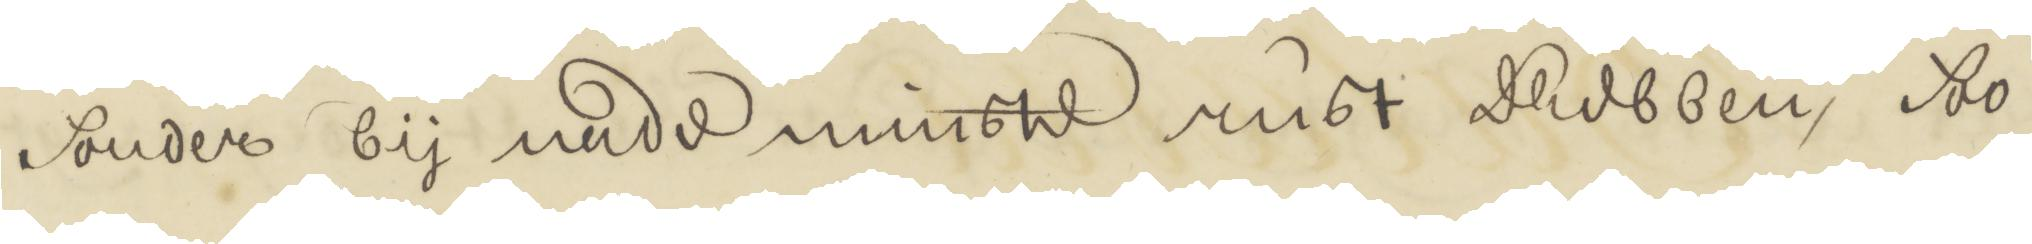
sonder bij nade minste rust tehebben, soo
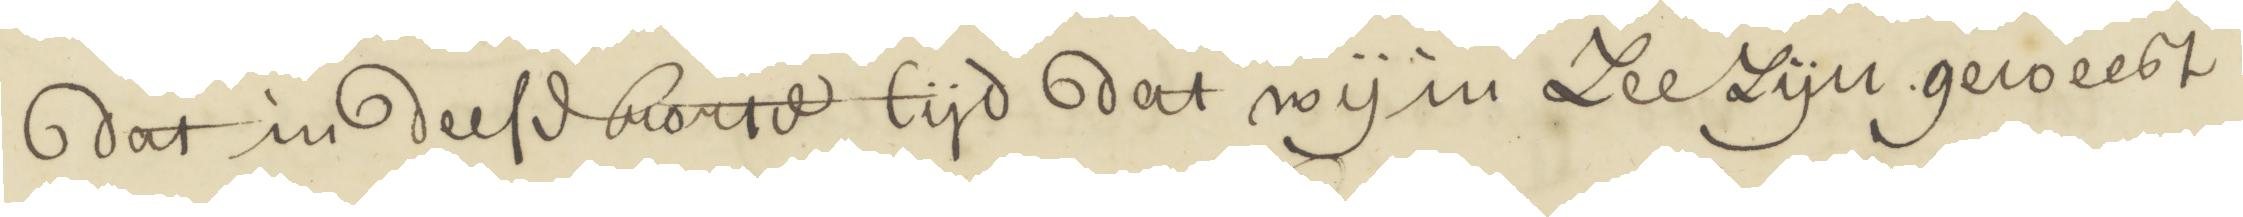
dat in deese korte tijd dat wij in zee zijn geweest
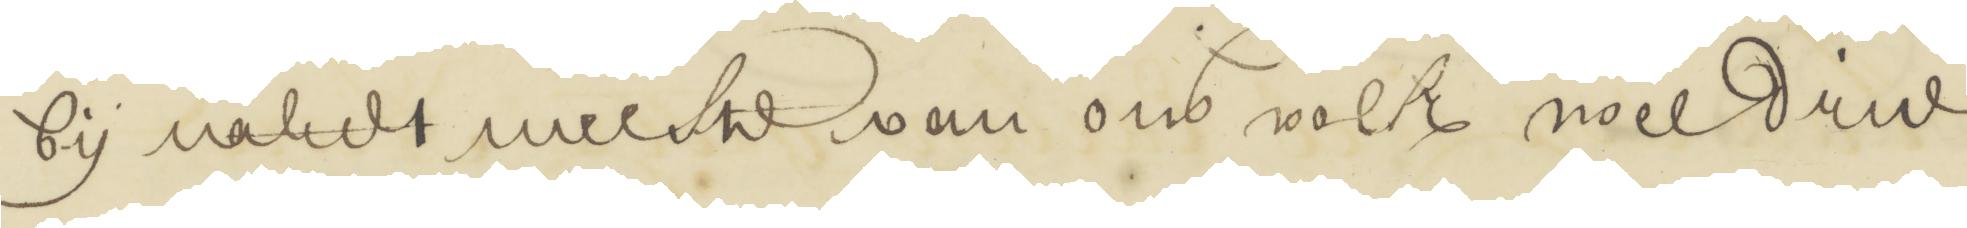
bij na het meeste van ons volk wel drie
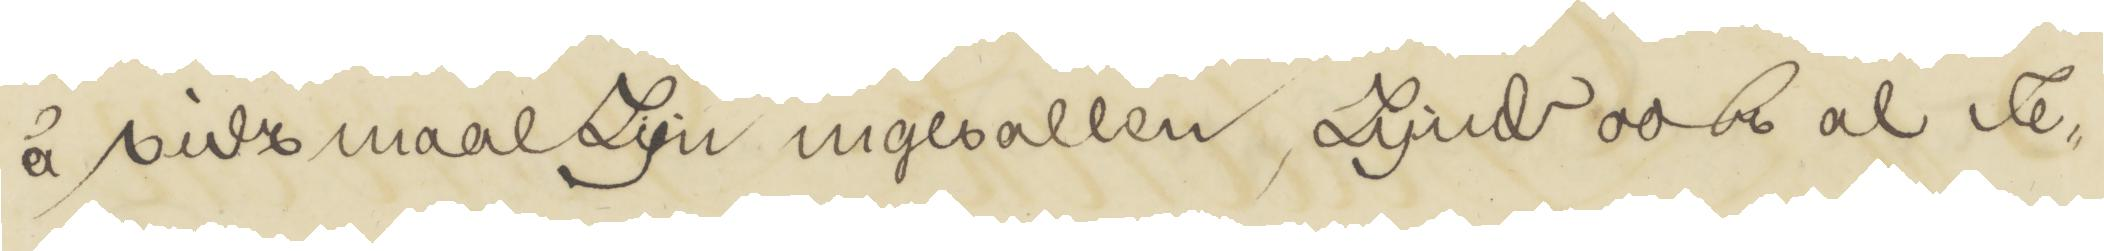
á vier maal zijn ingevallen, zijnde ook al Ee„
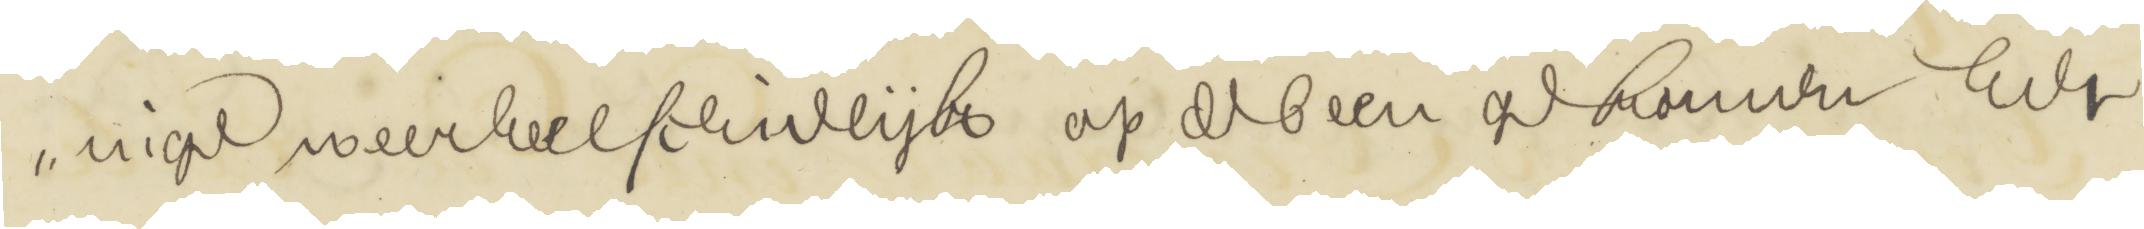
„nige weerheelschielijk op de been gekomen het
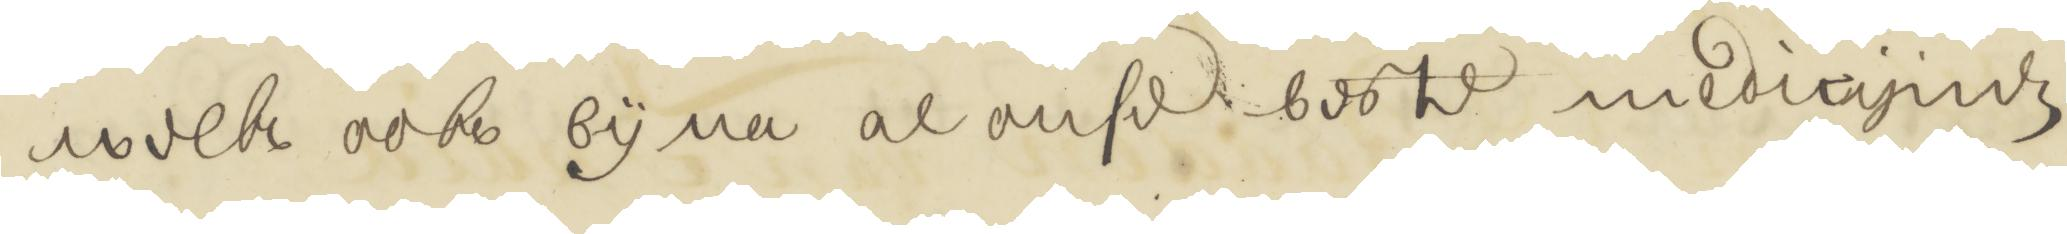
welk ook bij na al onse beste medicijnen
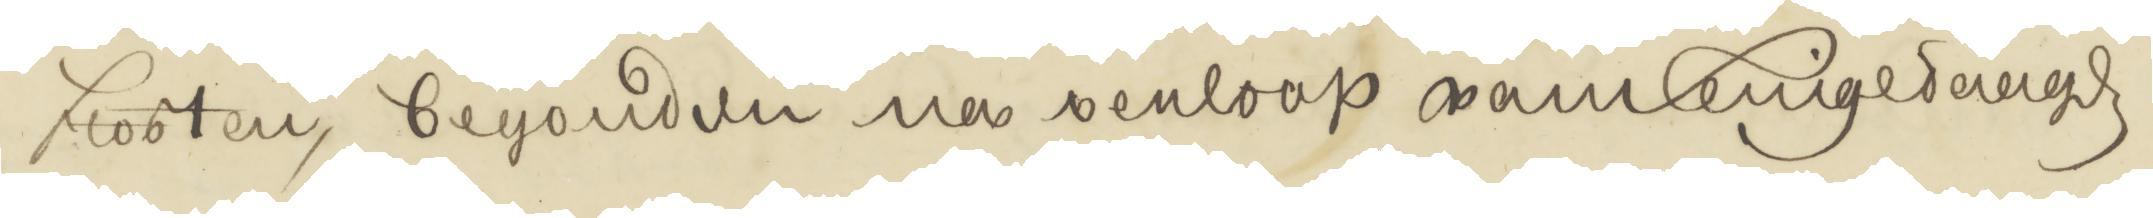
kosten, begonden na verloop van Eenigedaagen
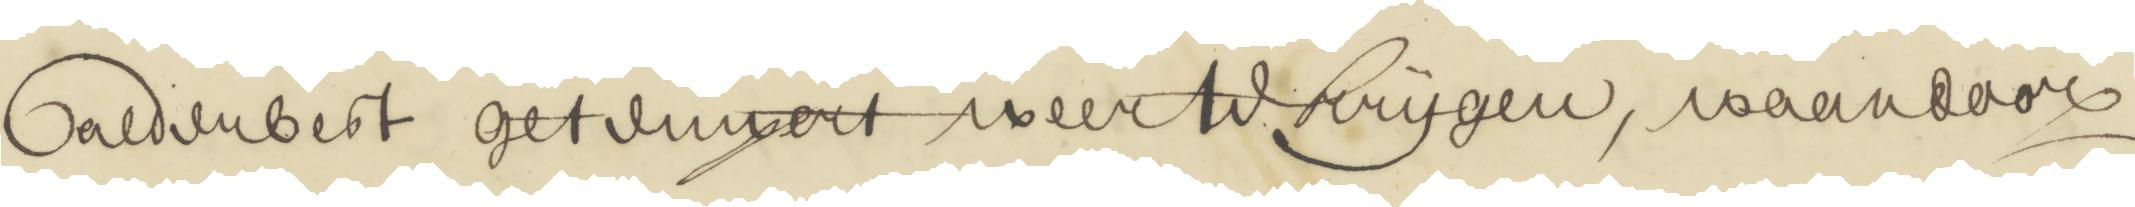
alderbest getempert weer te krijgen, waardoor
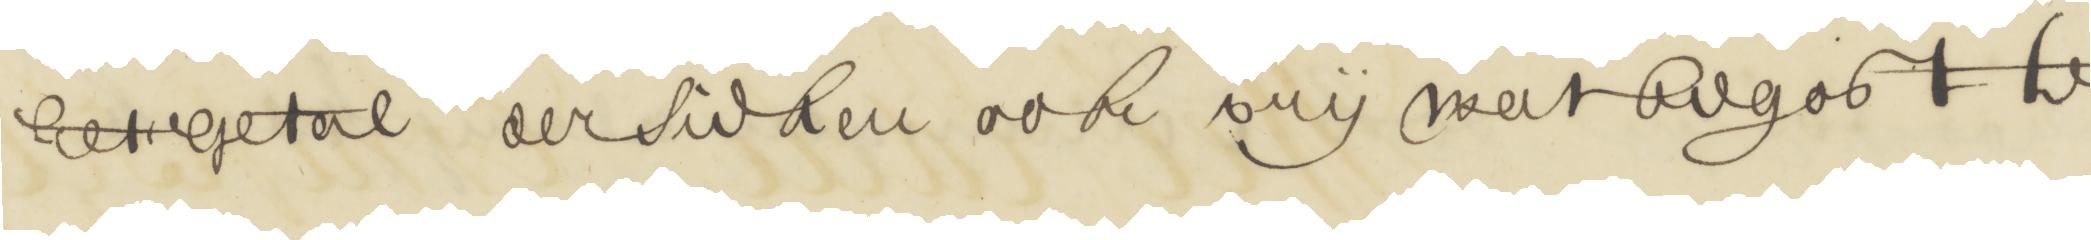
het getal dersieken ook vrij wat begost te
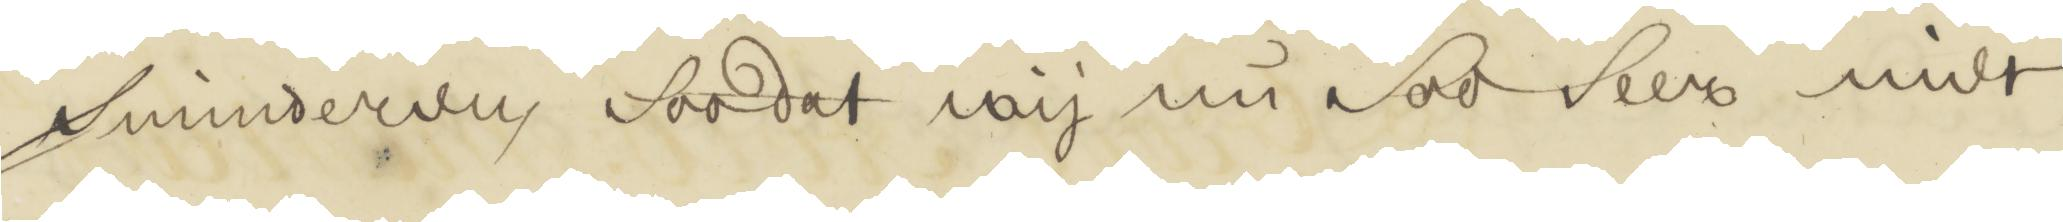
verminderen, soodat wij nu soo seer niet
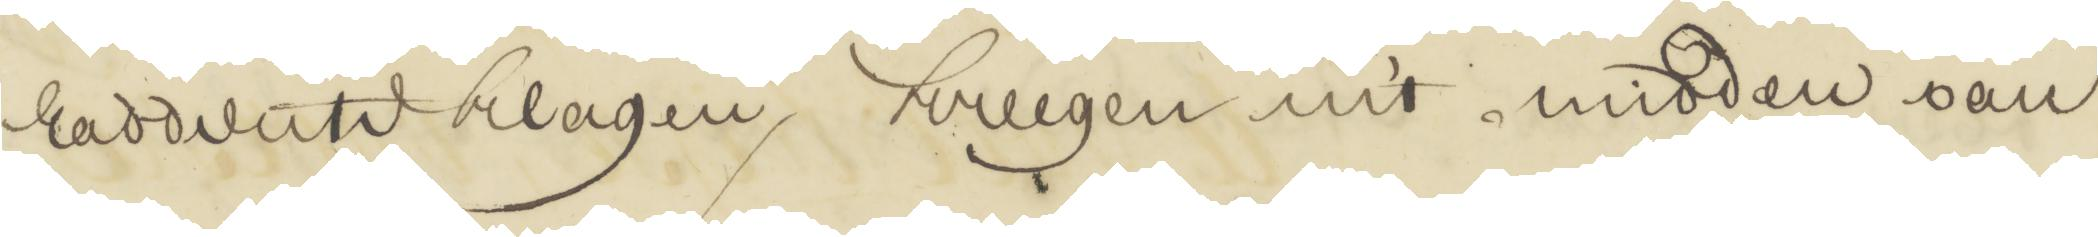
hadden te klagen, kreegen in’t midden van
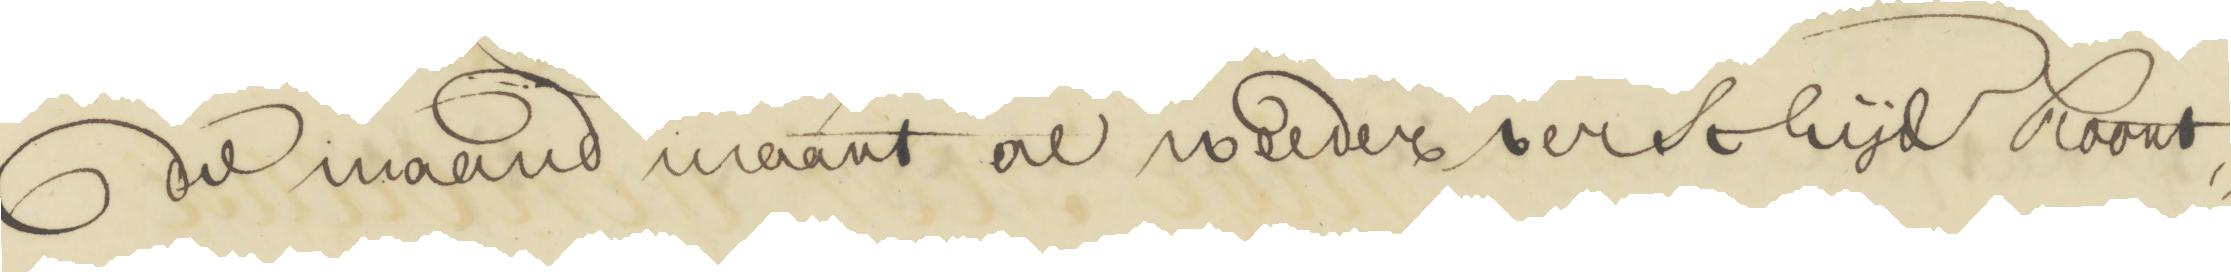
de maand maart al weeder verschijde koort
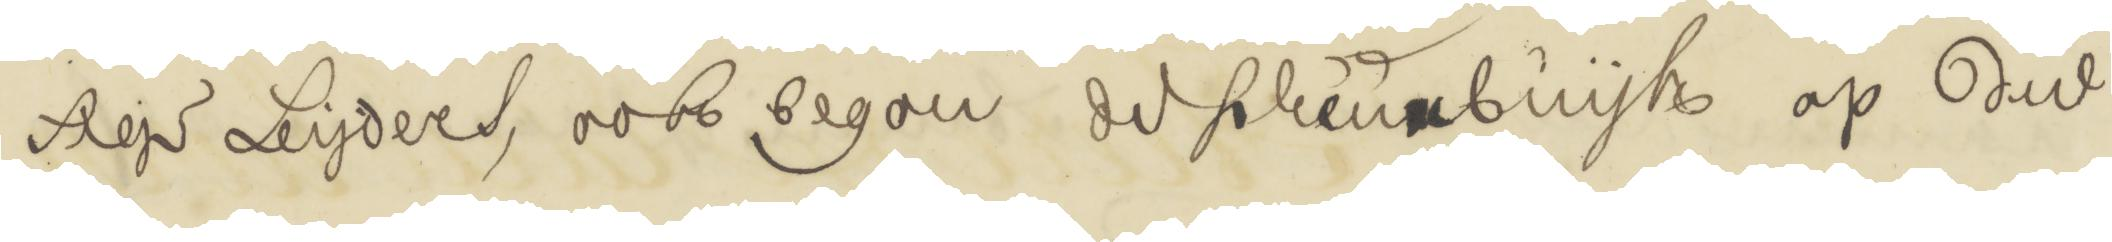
sige Leijders, ook begon descheurbuijk op die
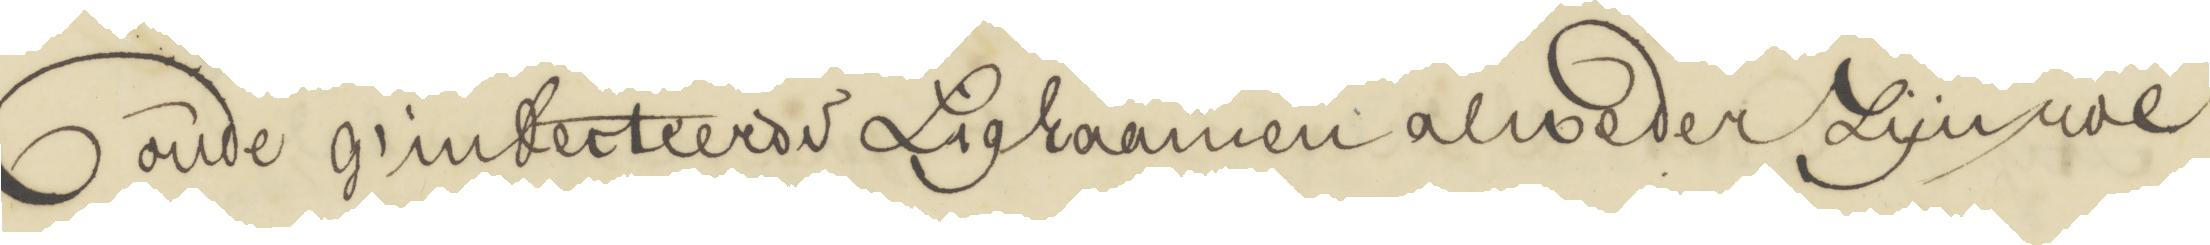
oude g’infecteerde Lighaamen alweder zijn rol
